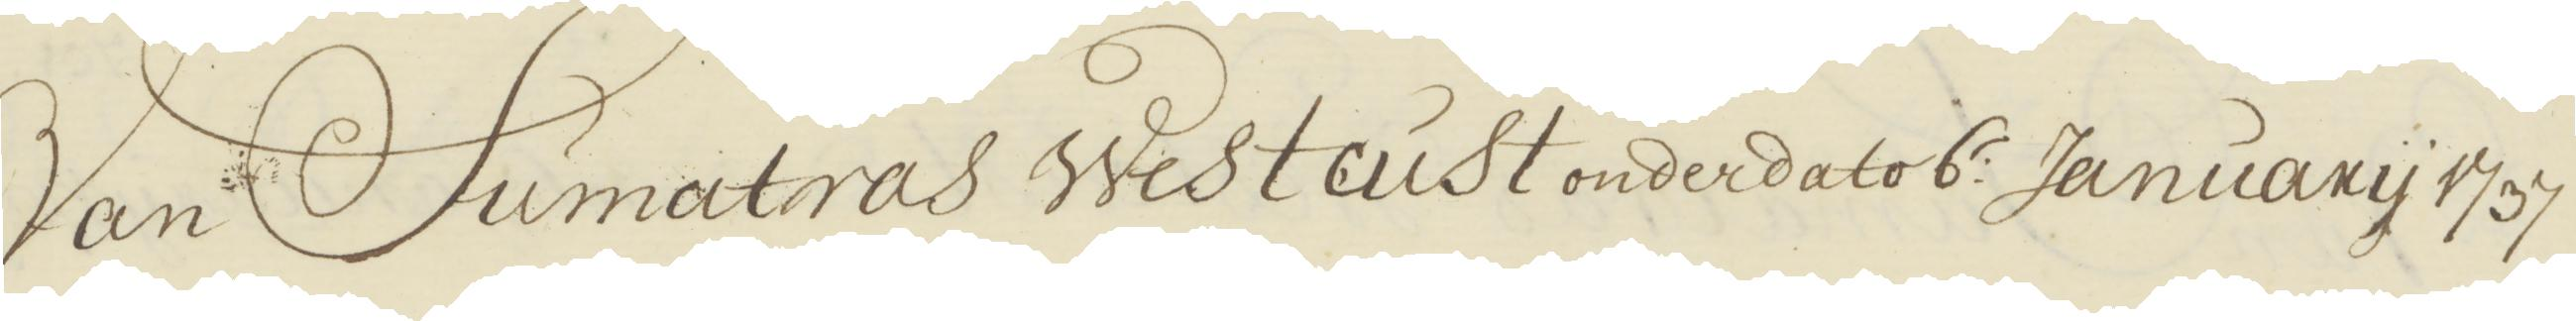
Van Sumatras Westcust onder dato 6:' Januarij 1737
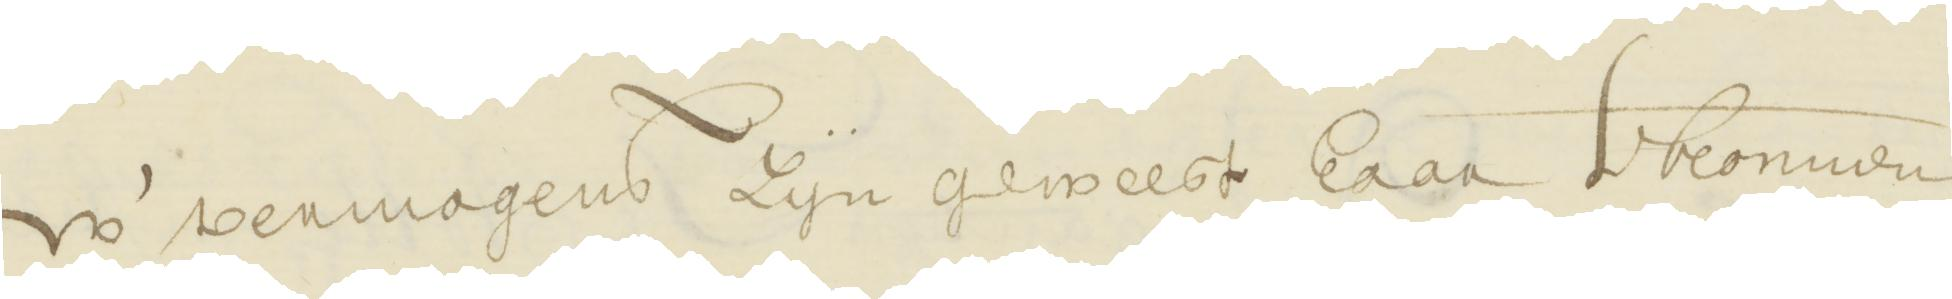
w' vermogens zijn geweest haar t konnen
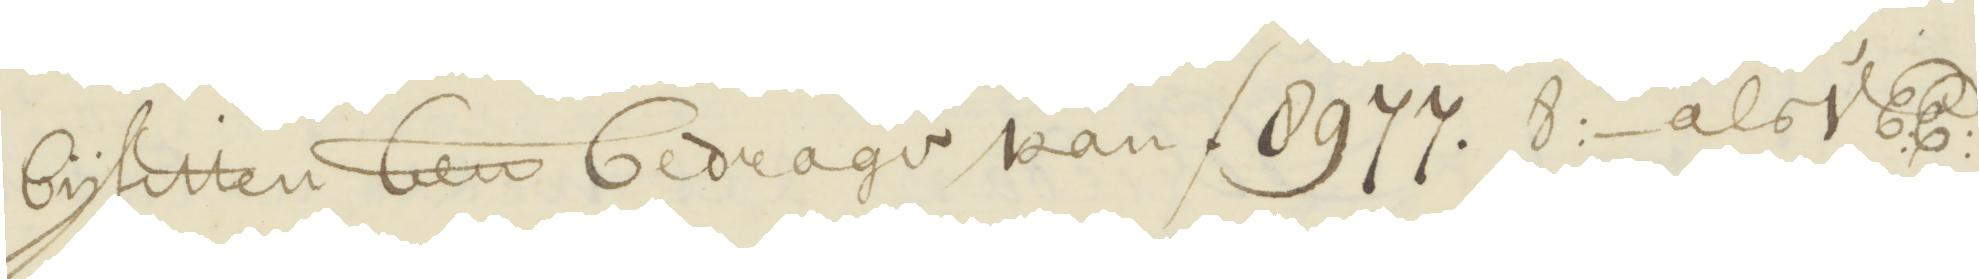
bijsetten ten bedrage van ƒ8977. 8: – als UE:E:
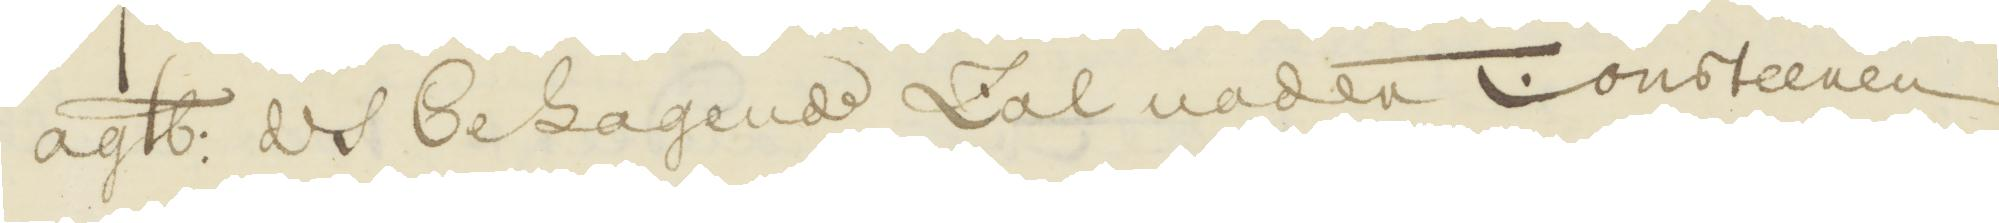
agtb: des behagende zal nader Consteeren
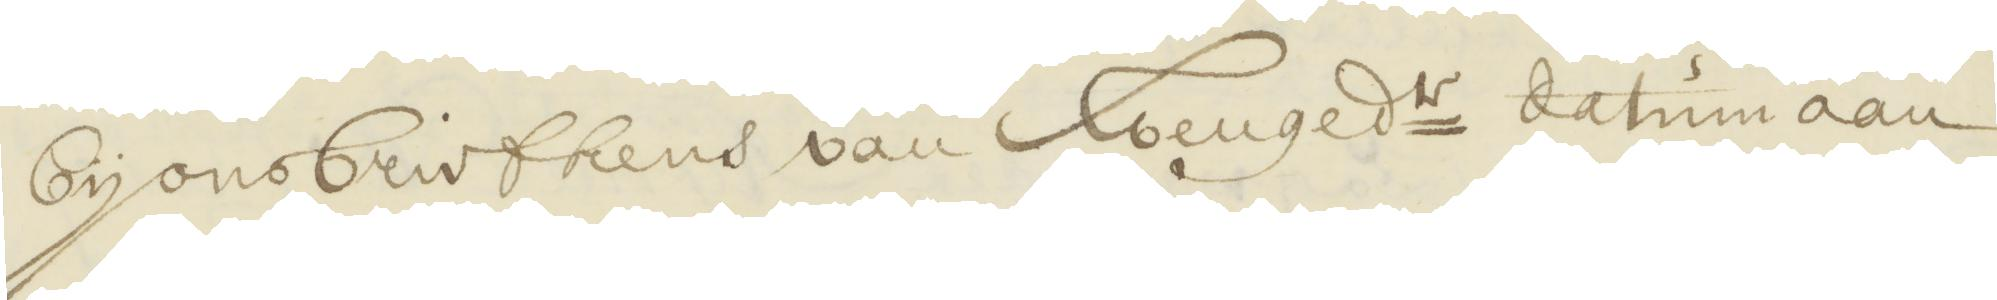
bij ons briefkens van Evenged=te datum aan
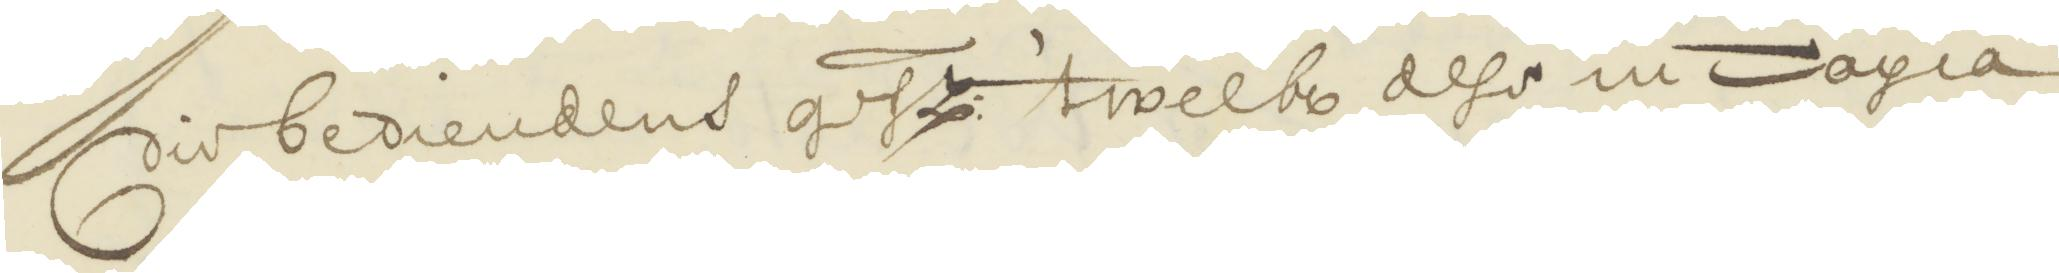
die bediendens gesz: ’twelk dese in Copia
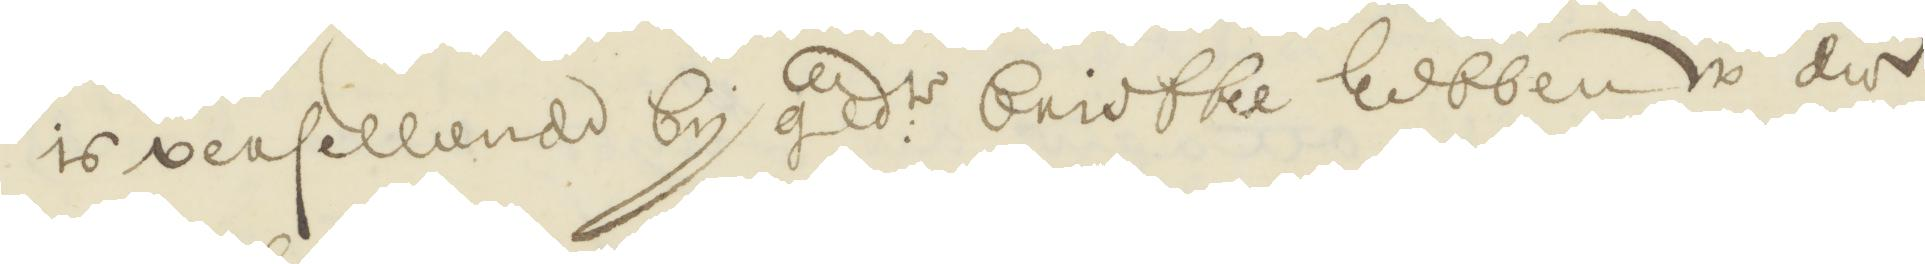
is versellende bij ged:te briefke hebben w' die
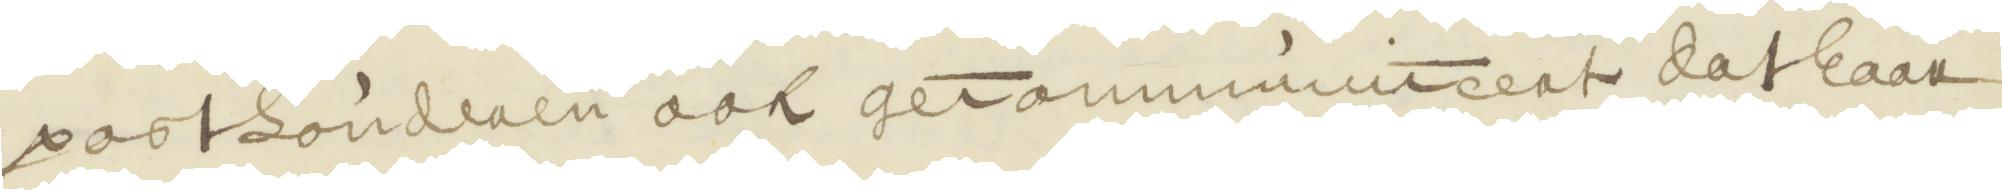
posthouderen ook gecommuniceert dat haar
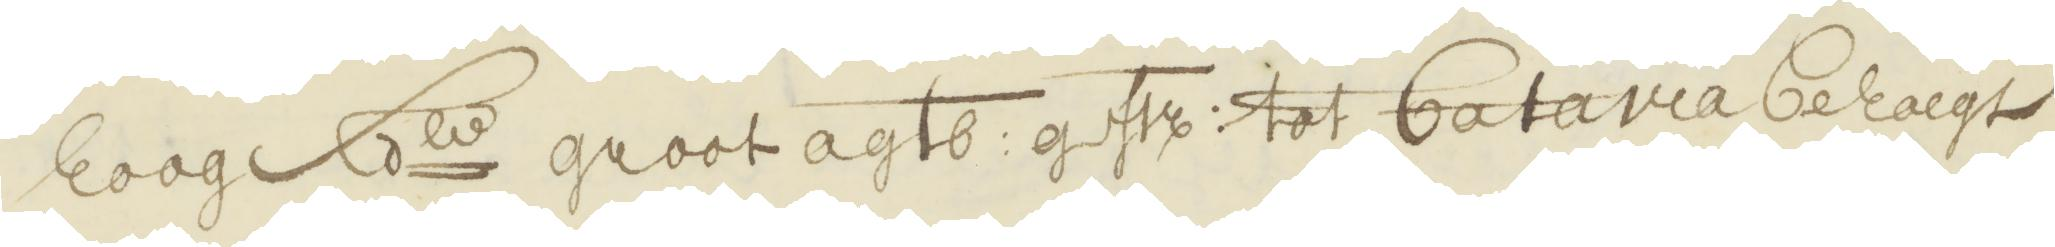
hoog Ed=le groot agtb: gestr: tot batavia behaegt
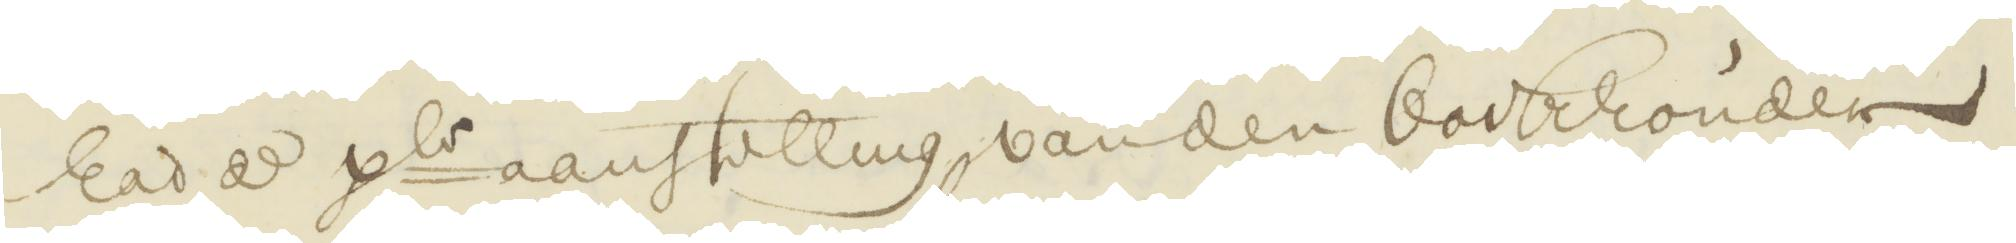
had de p=le aanstelling van den boekhouder
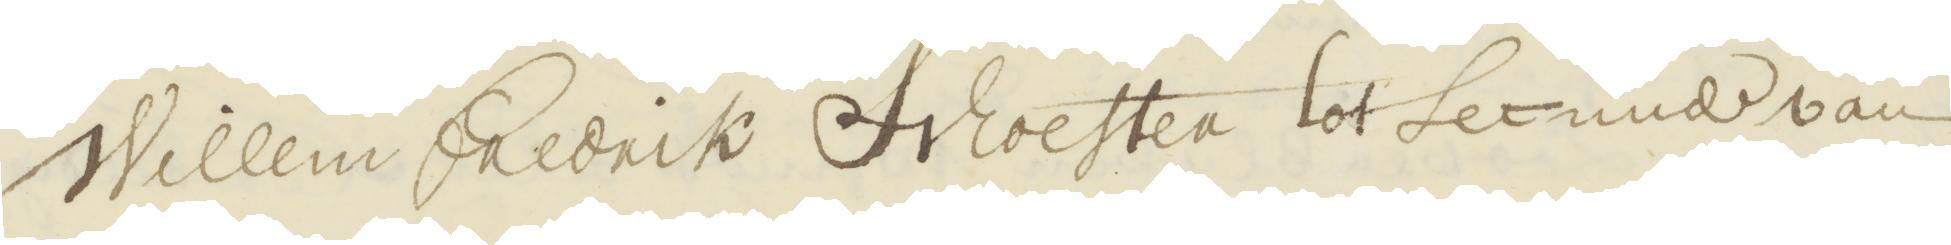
Willem Fredrik Schoester tot secunde van
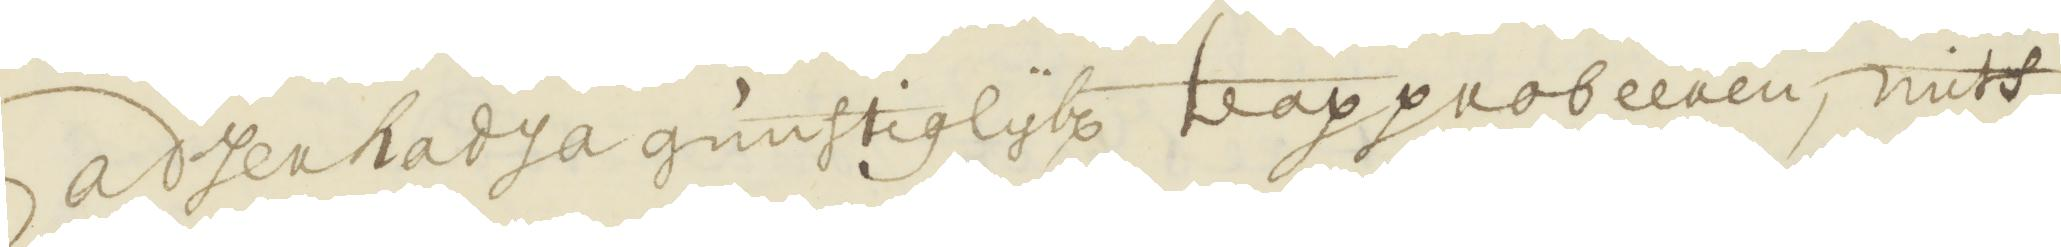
adjerhadja gunstiglijk te approbeeren, mits
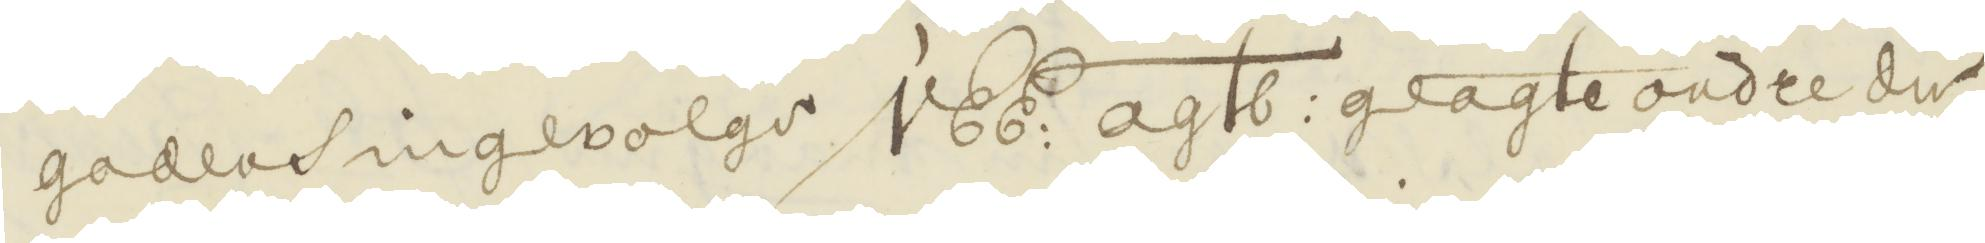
gaders ingevolge UEE: agtb: geagte ordre die
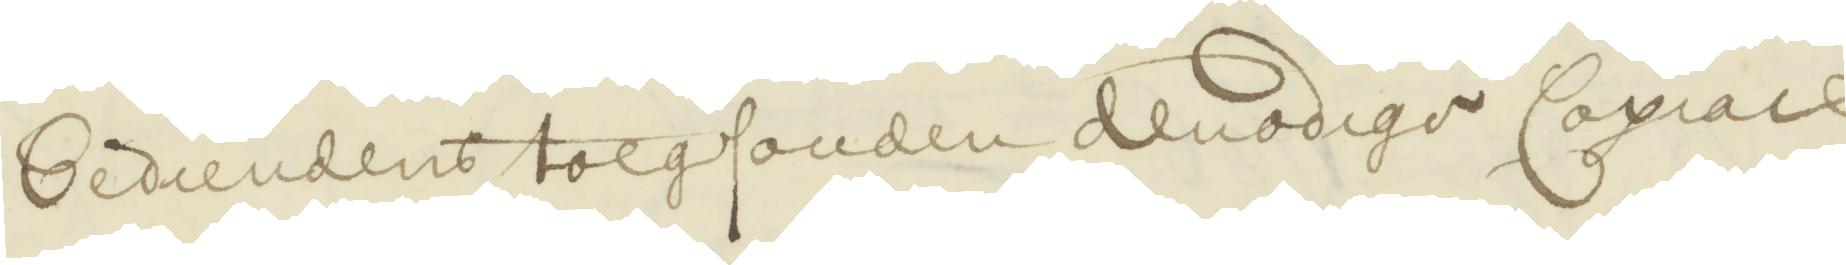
bediendens toegsonden denodige Copia Ex
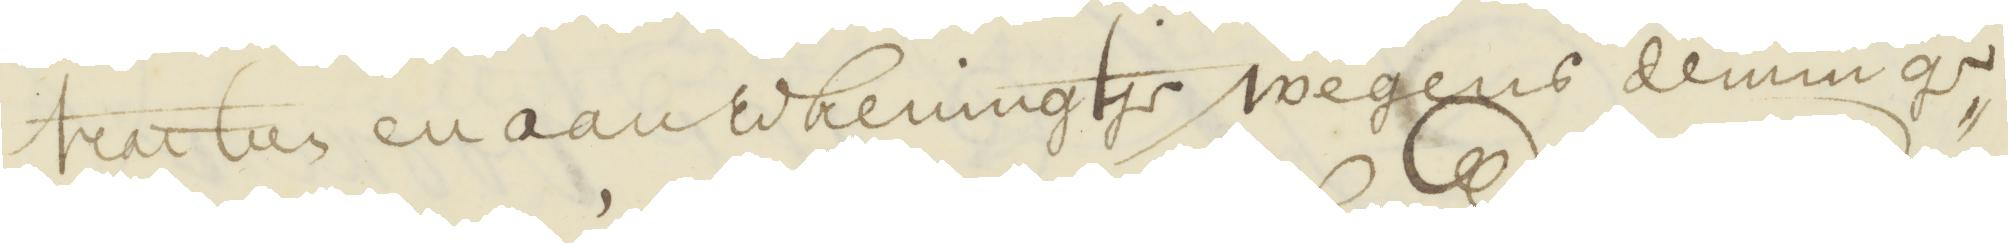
tracten en aan rekeningtje wegens de min ge„
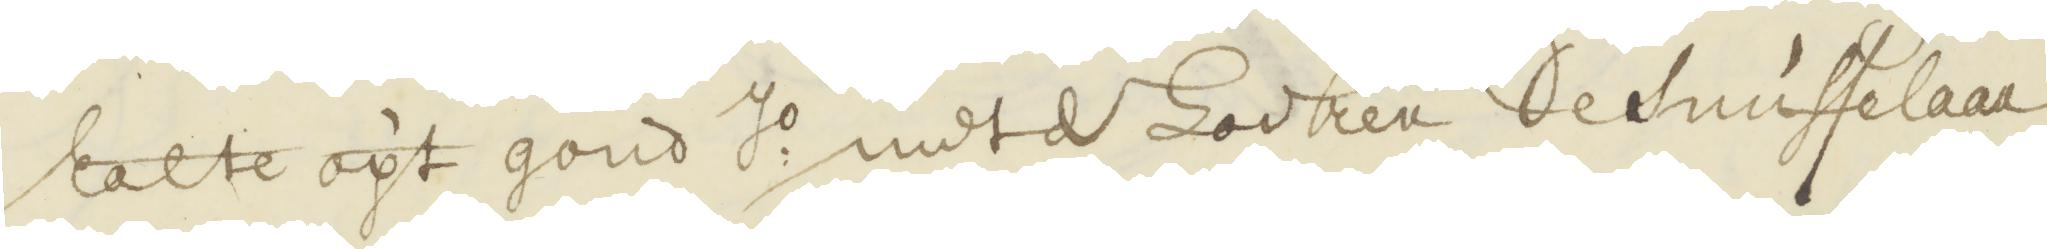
halte op’t goud J:o met de Hoeker de Snuffelaar
